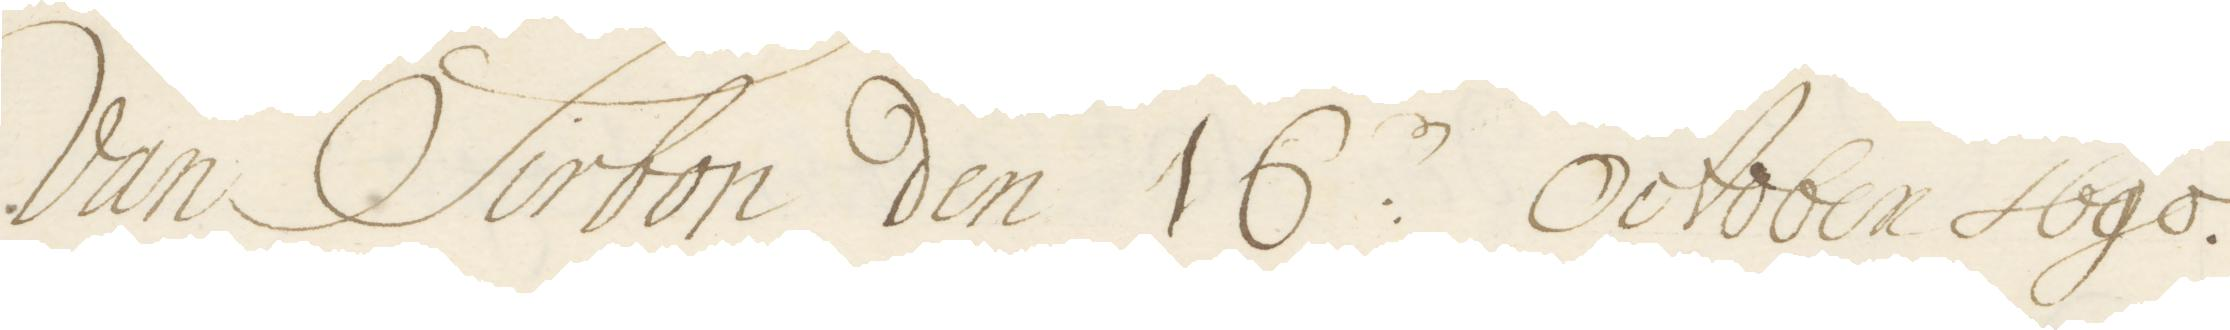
Van Sirbon den 16:en October 1690.
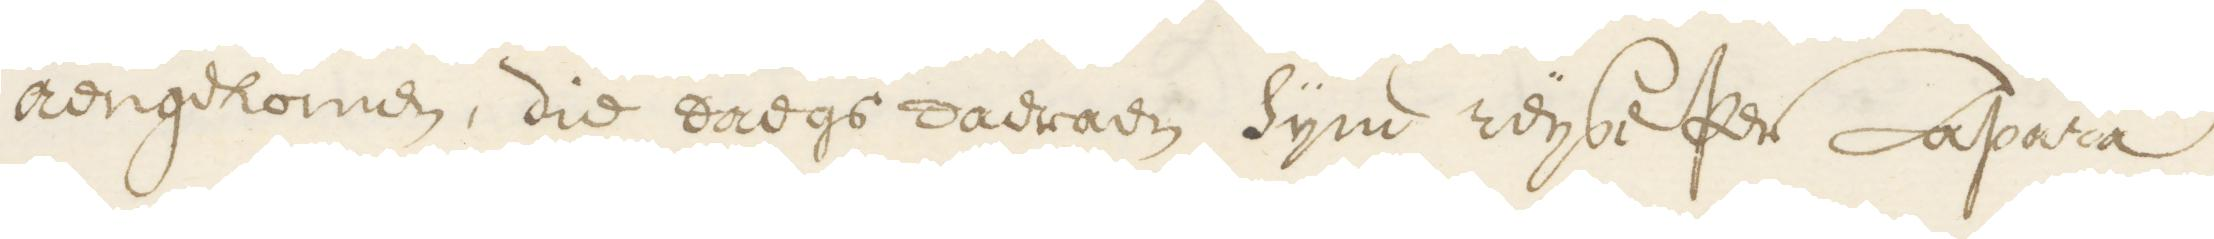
aengekomen, die daegs daeraen sijne reijse per capara
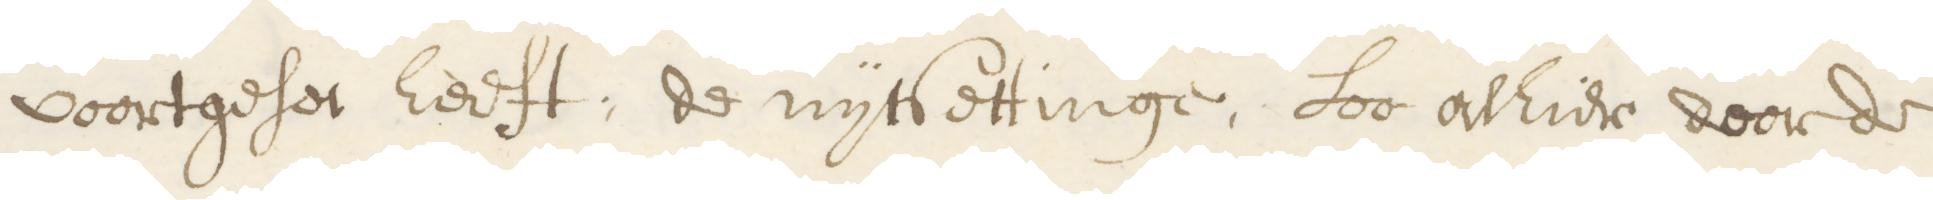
voortgeset heeft; de uijtsettinge, soo alhier door de
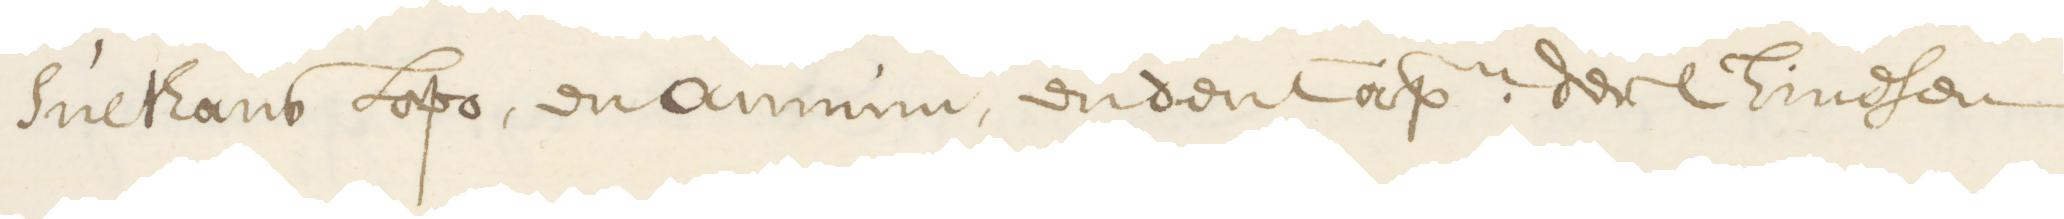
sulthans sopo, en amnim, en den cap. der Chinesen
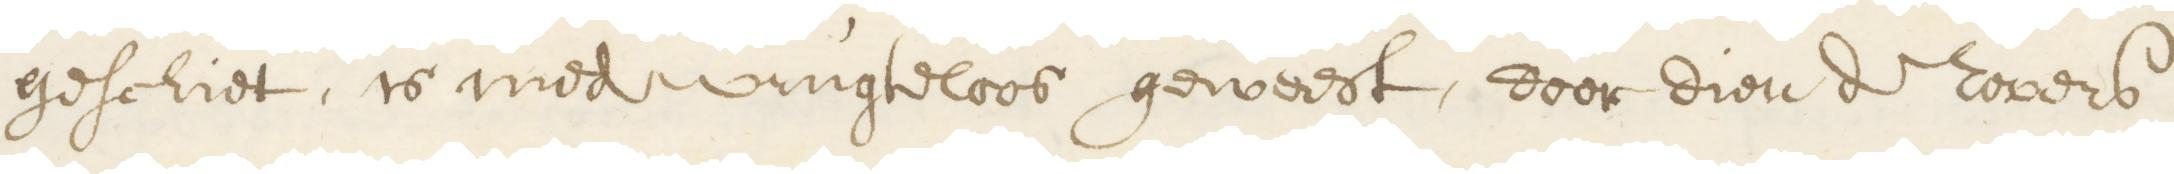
geschiet, is mede vrugteloos geweest, door dien de rovers
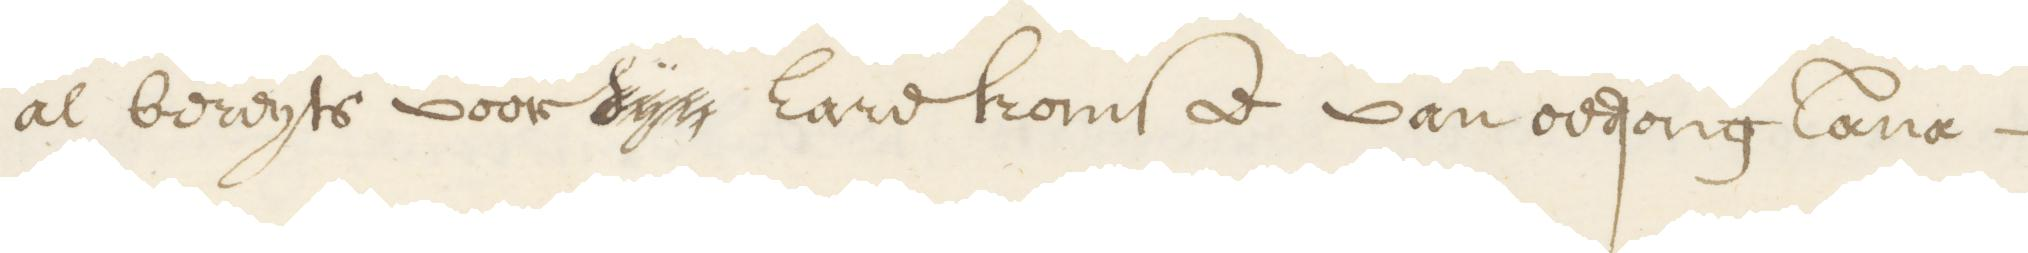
al bereijts voor sijn hare komste van oedjong Tana —
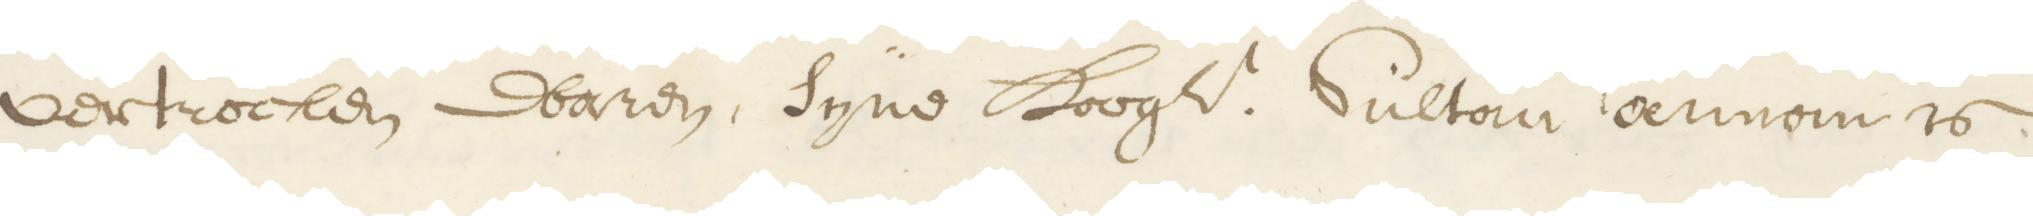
vertrocken waren, sijne Hoogh.t sultan annom is
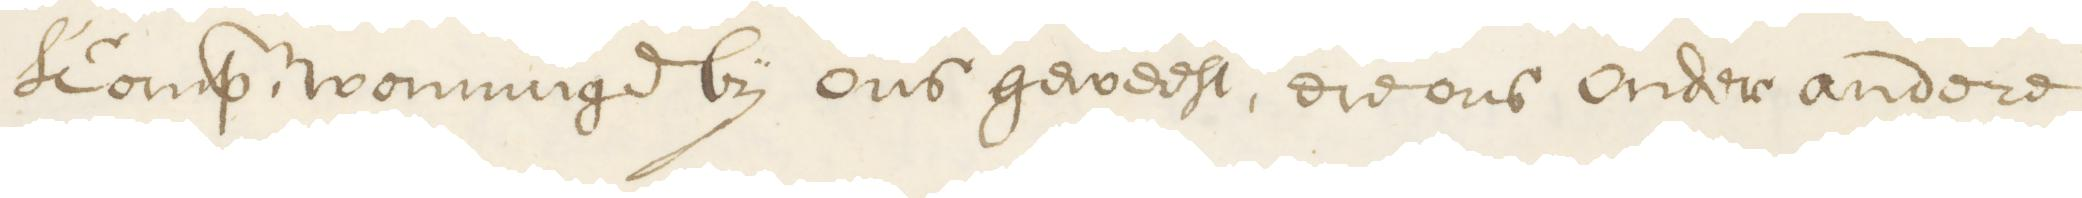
s'Comp: wonninge bij ons geweest, die ons onder andere
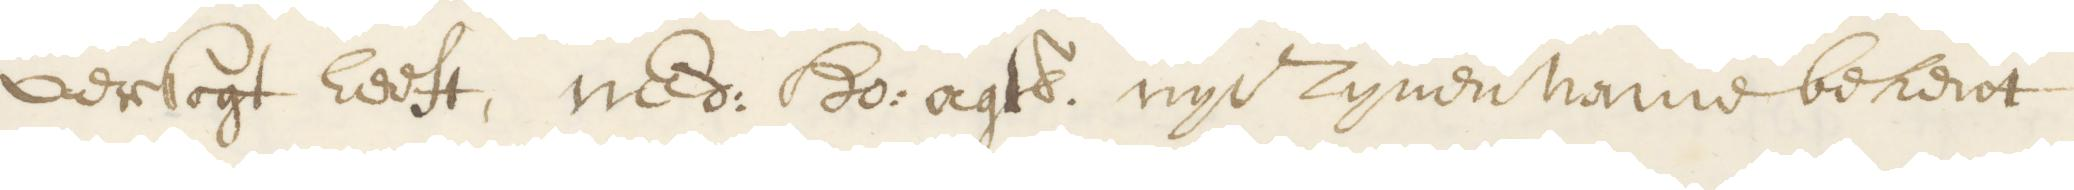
versogt heeft, vEd: Ho: agtb: uijt zijnen name bekent
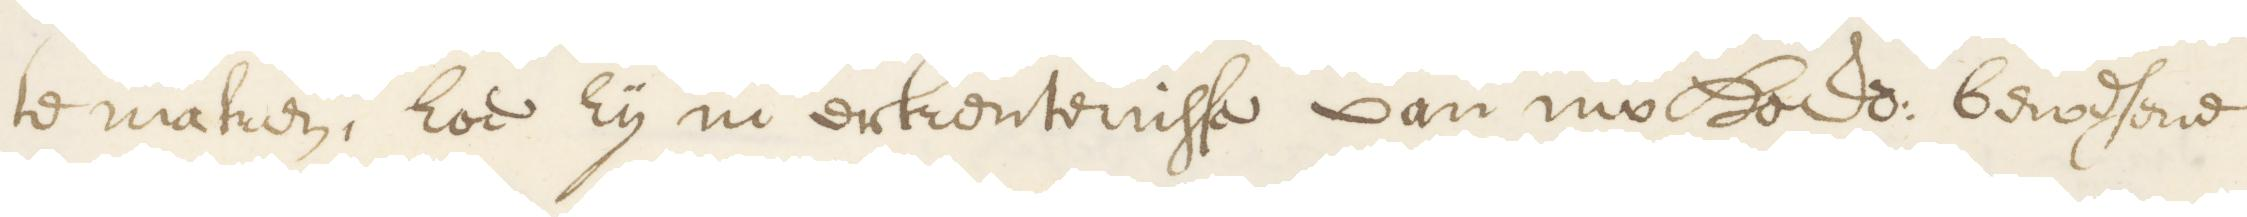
te maken, hoe hij in erkentenisse van uw Ho Ed: bewesene
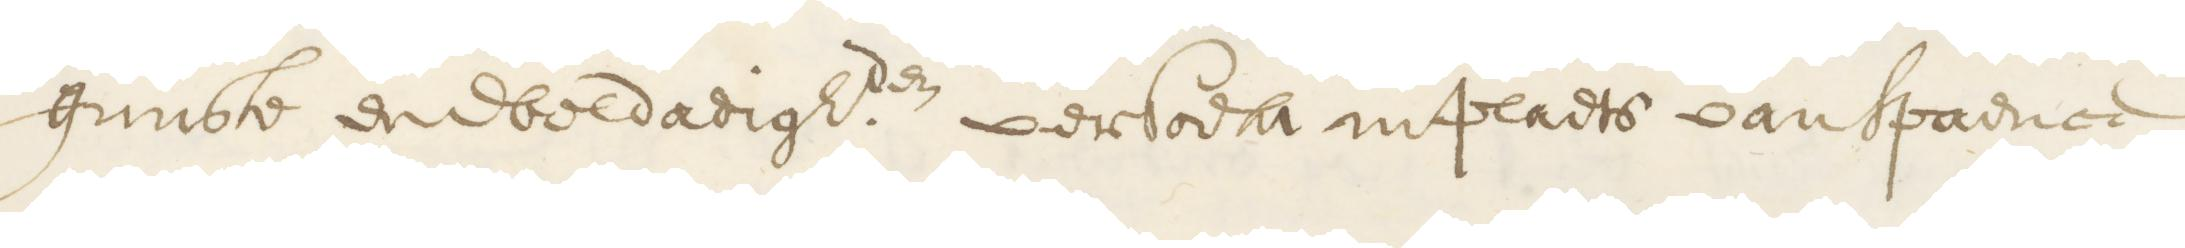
gunste en weldadigh:den versoekt inplaets van spaence
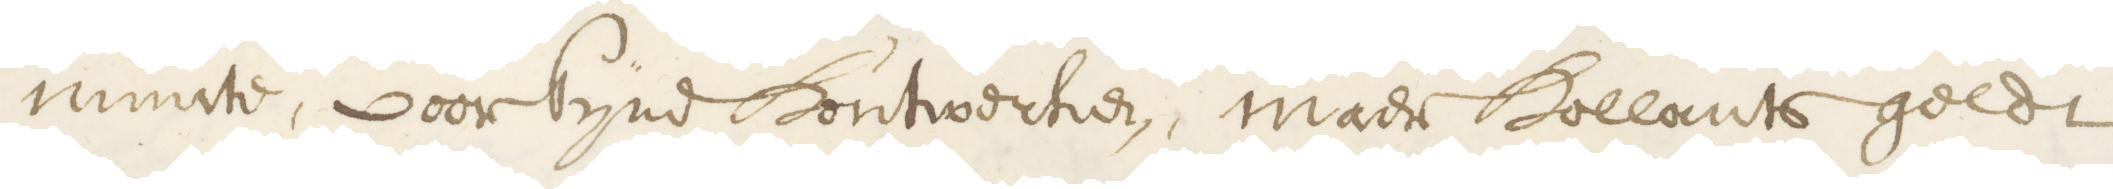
munte, voor sijne Houtwerken, maer Hollants geldt
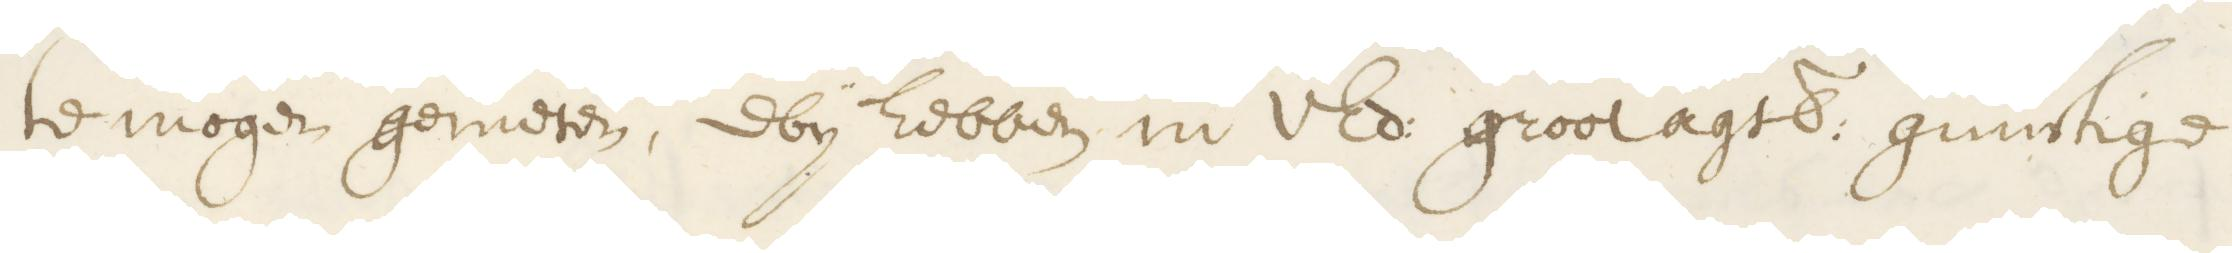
te mogen genieten, wij hebben in VEd: groot agtb: gunstige
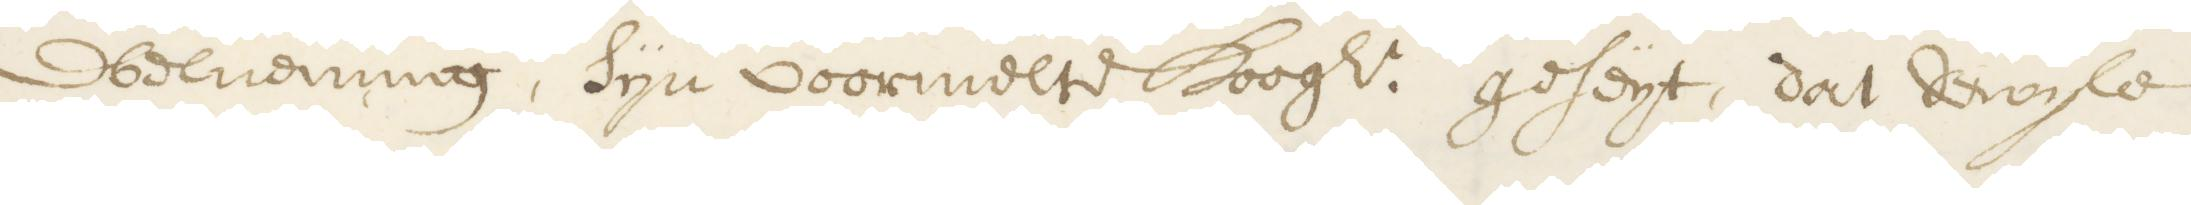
welneming, sijn voormelte Hoogh:t geseijt, dat dewijle
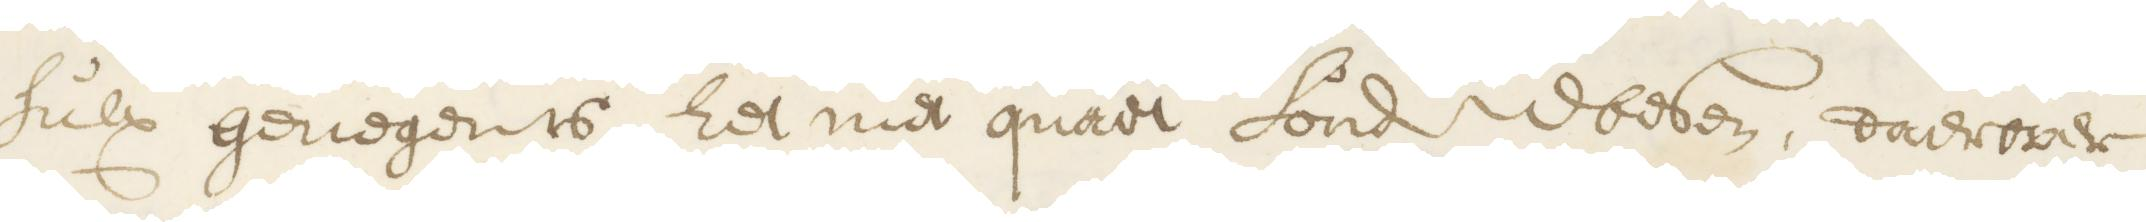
sulx genegen is, het niet quaet soude wesen, daerover
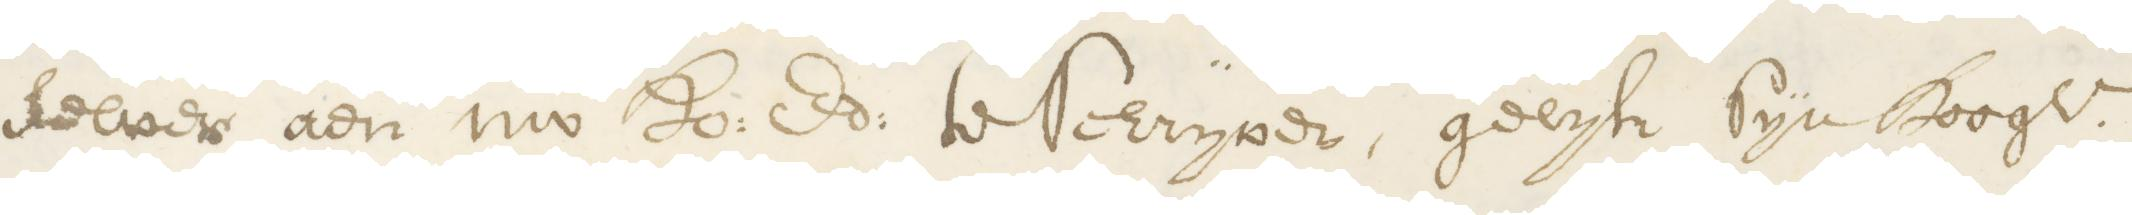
selver aen uw Ho: Ed: te schrijven, gelijk sijn Hoogh:
